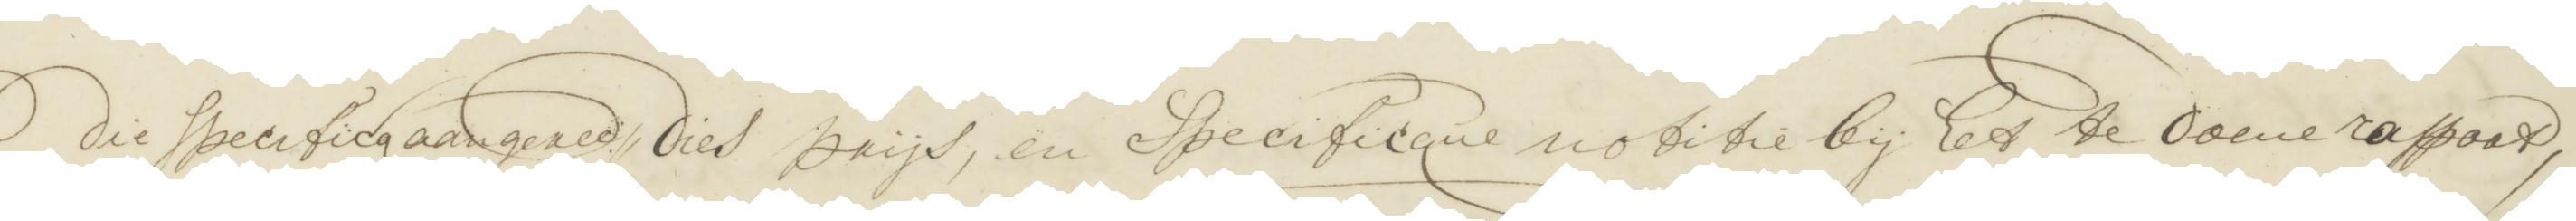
die specificq aan geree„ dies prijs, en specificque notitie bij het te doene rapport,
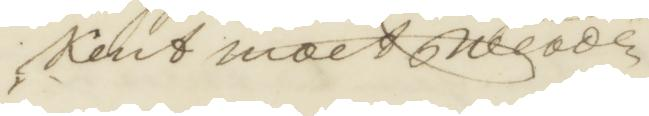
kent moet werden
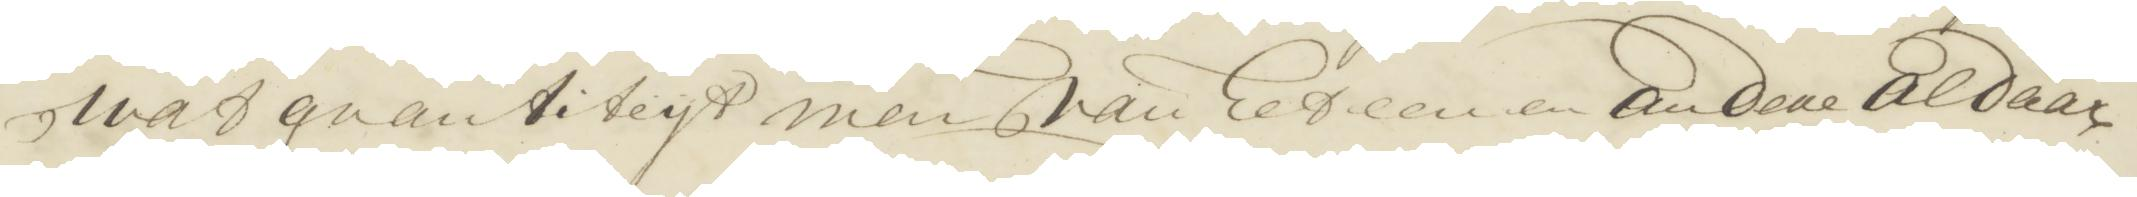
wat quantiteijt men van het een en andere aldaar
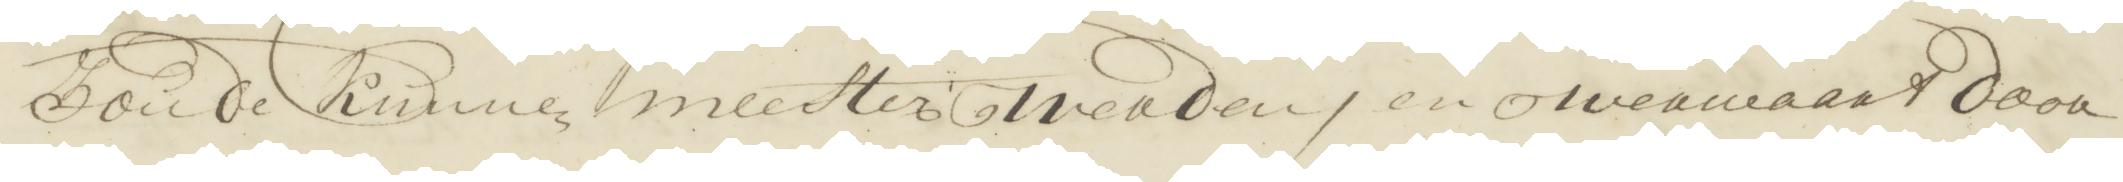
zoude kunnen meester werden, en werwaart door
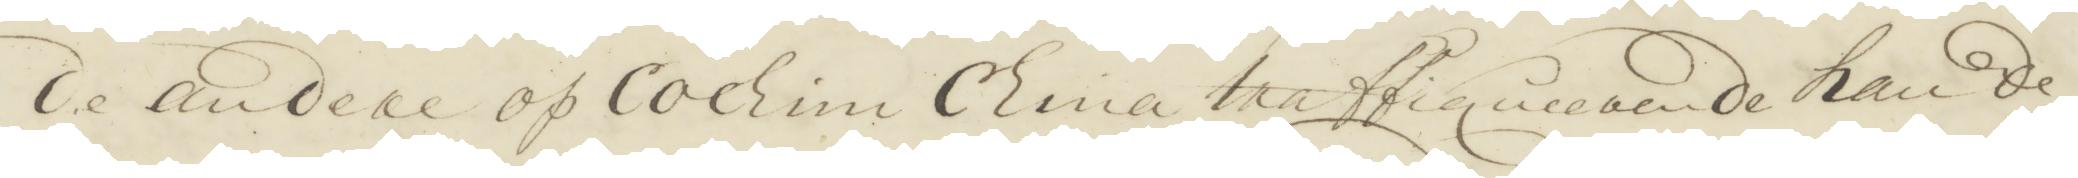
de andere op cochim china traffiqueerende hande
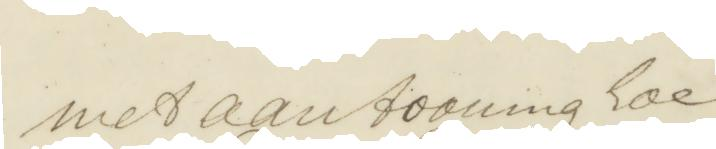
met aantooning hoe
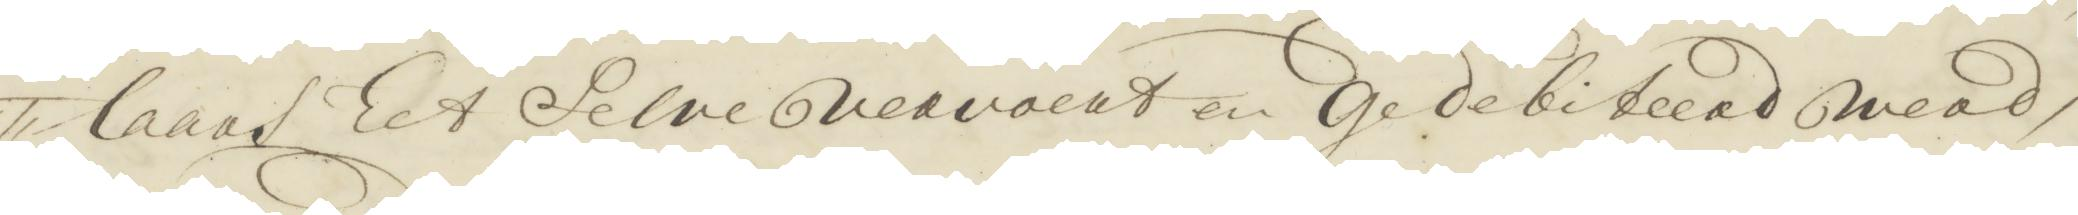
laars het selve vervoert en gedebiteerd werd,
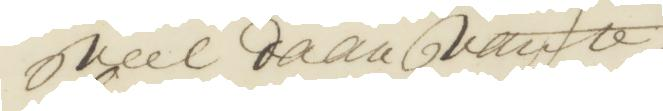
veel daar van te
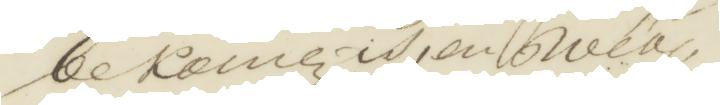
bekomen is en wer„
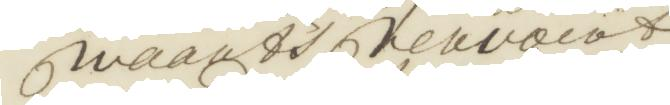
waarts vervoert
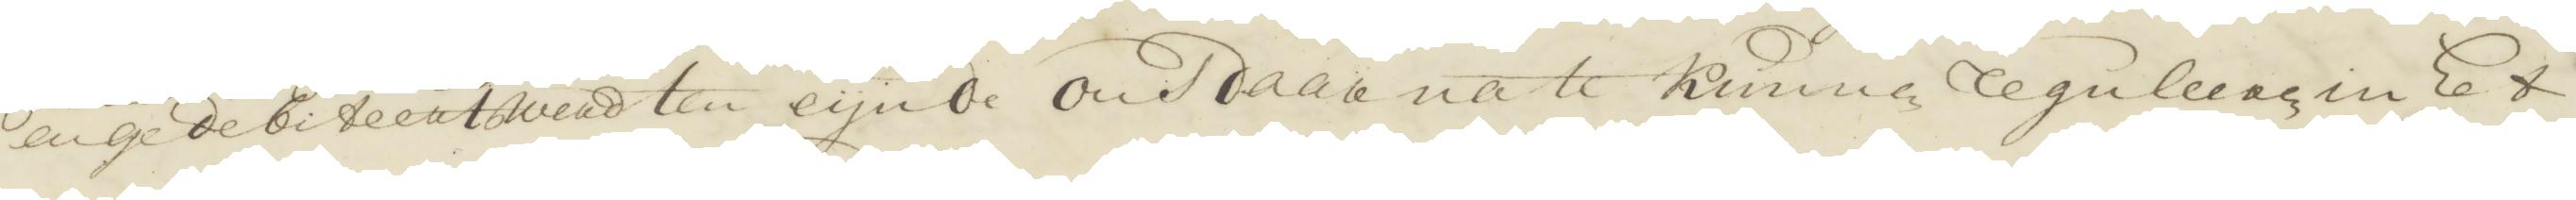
en gedebiteert werd ten eijnde ons daar na te kunnen reguleeren in het
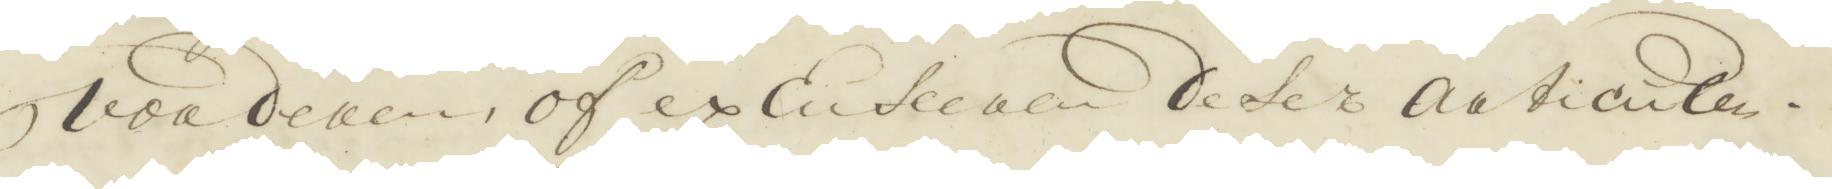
vorderen, of excuseeren deser articulen.
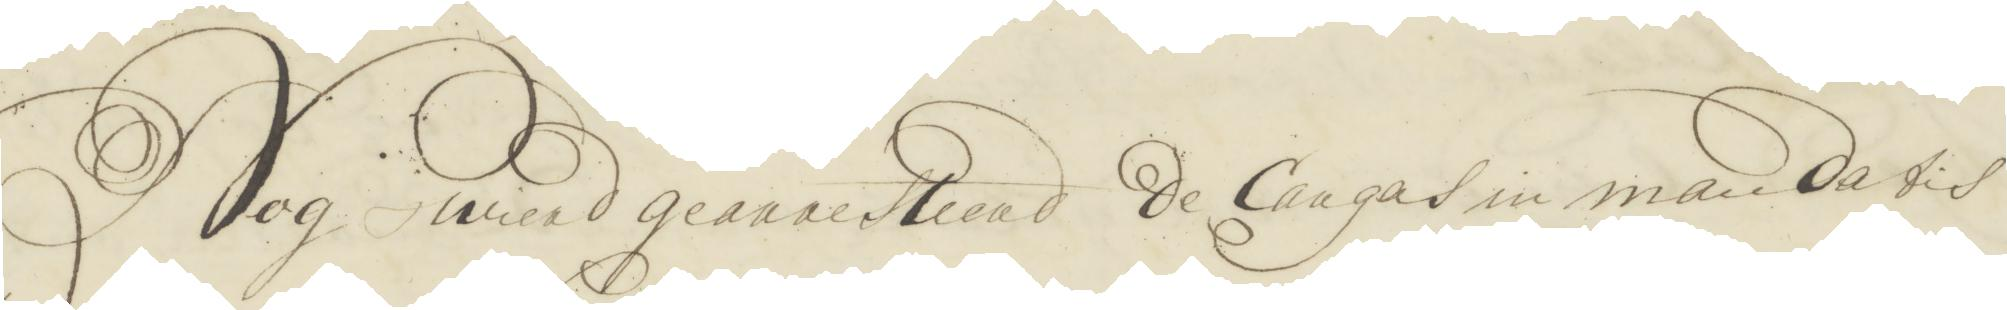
Dog wierd gearresteerd de cargas in mandatis
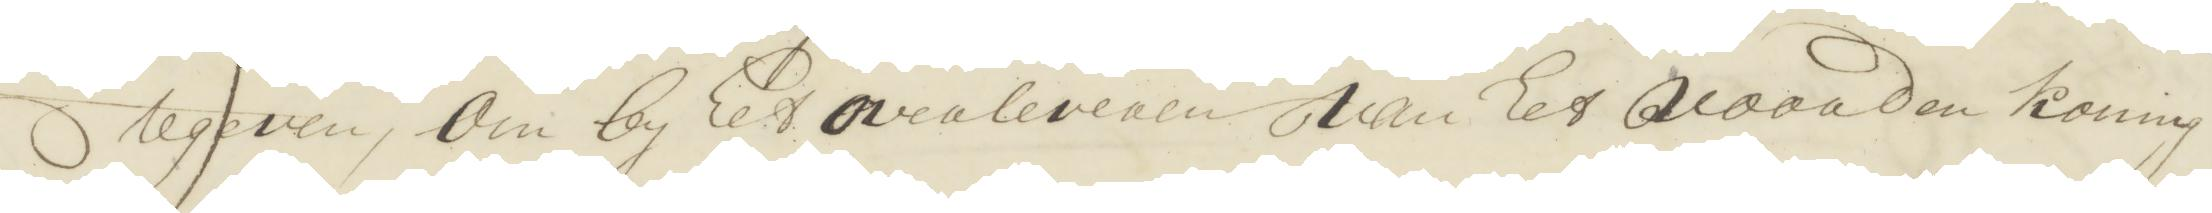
tegeven, om by het overleveren van het voor den koning
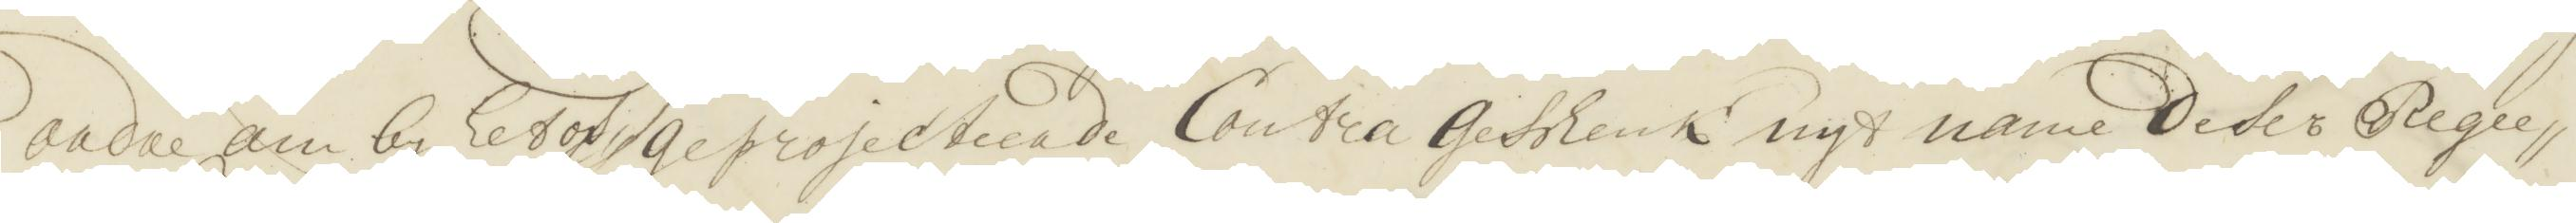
ordre om by het op„ geprojecteerde contra geschenk uijt name deser Regee„
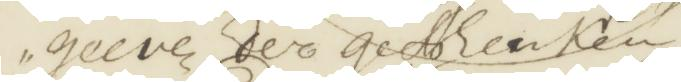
„geeve der geschenken
